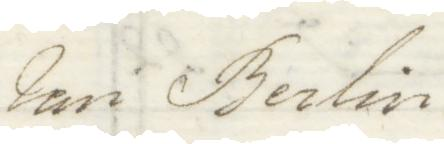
van Berlin
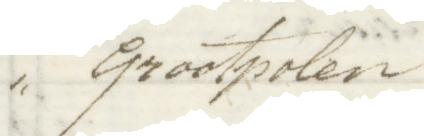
„ Grootpolen
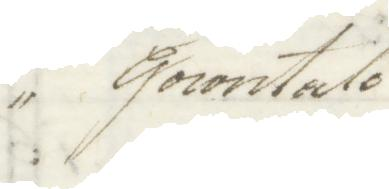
„ Gorontalo
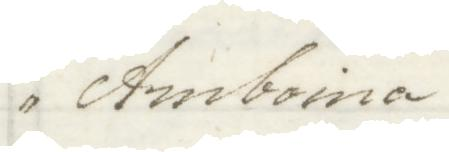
„ Amboina
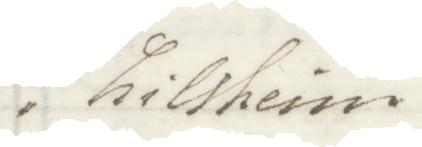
„ hilsheim
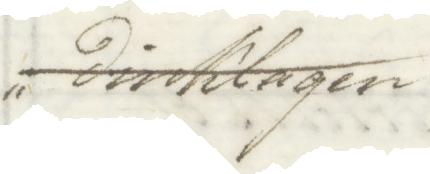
„ dinklagen
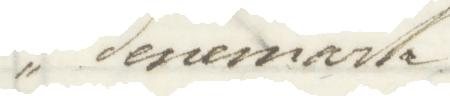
„ denemark
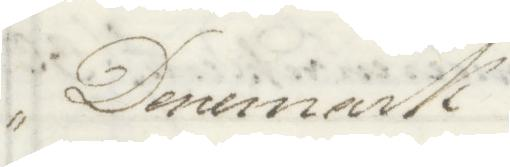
„ Denemark
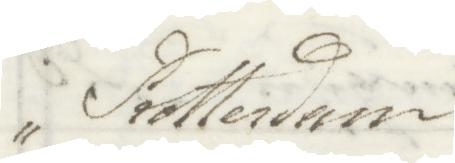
„ Rotterdam
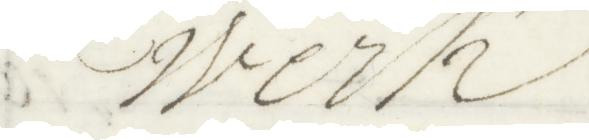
Werk
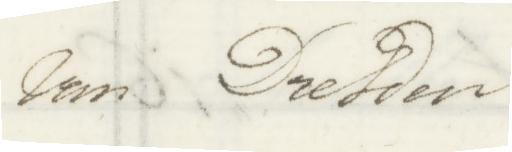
van Dresden
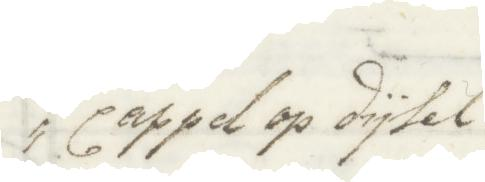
„ Cappel op dijsel
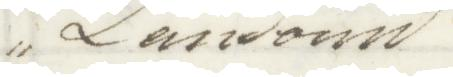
„ Landouw
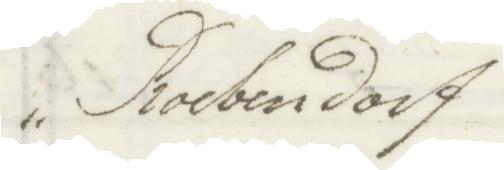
„ Roebendorf
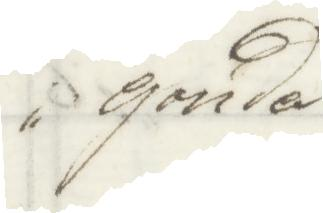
„ Gouda
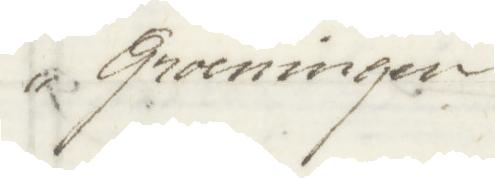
Groeningen
